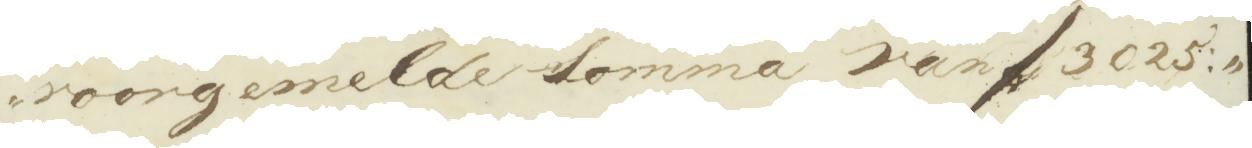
„voorgemelde somma van ƒ 3025: „
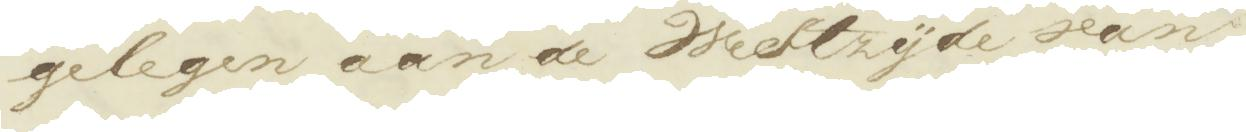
gelegen aan de Westzijde van
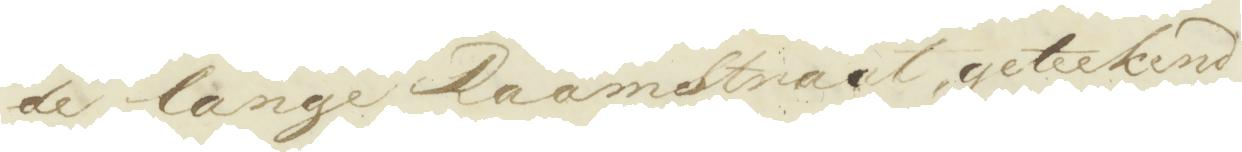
de lange Raamstraat, geteekend
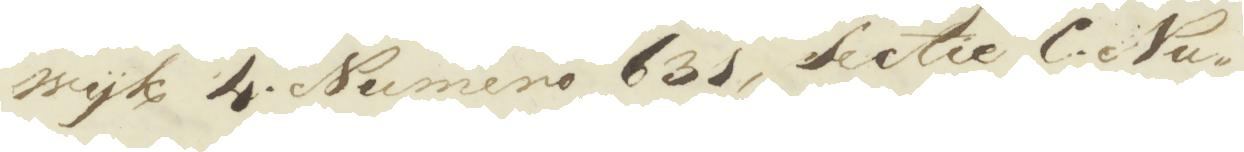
wijk 4. Numero 631, Sectie C Nu„
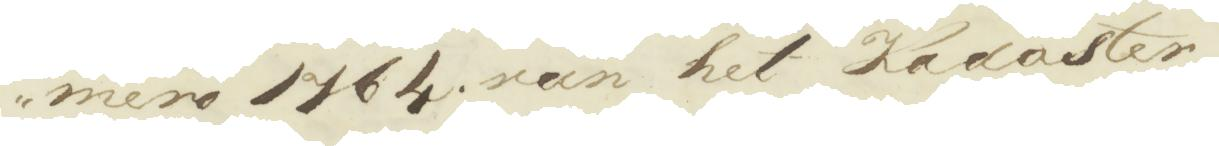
„mero 1764 van het Kadaster,
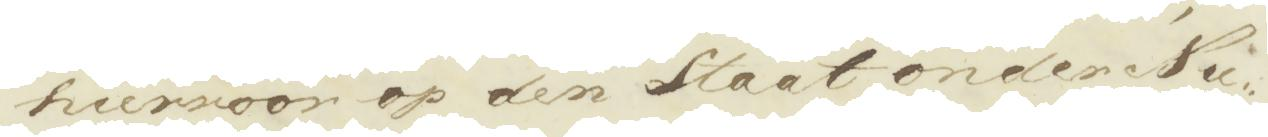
hiervoor op den Staat onder Nu„
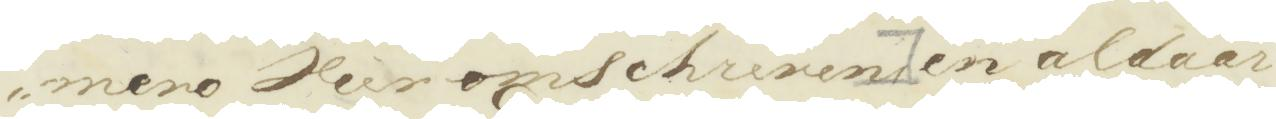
„mero Vier omschreven] en aldaar
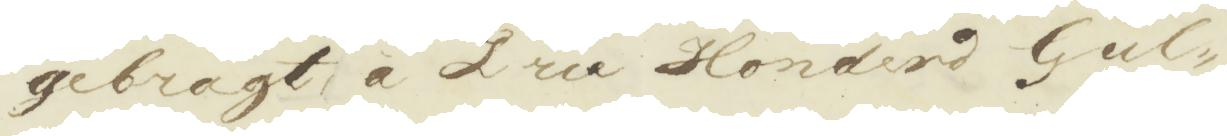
gebragt, à Drie Honderd Gul„
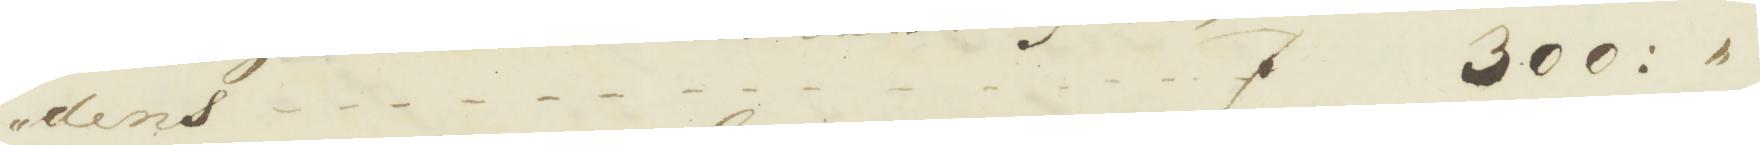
„dens - - - - - - - - - - - - - - - ƒ 300: „
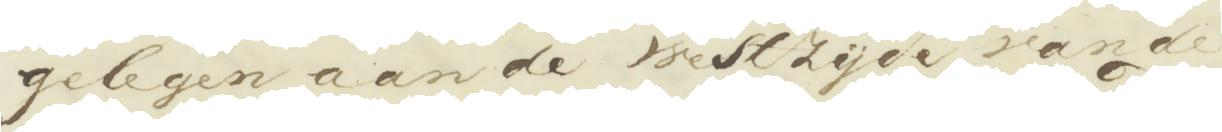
gelegen aan de westzijde van de
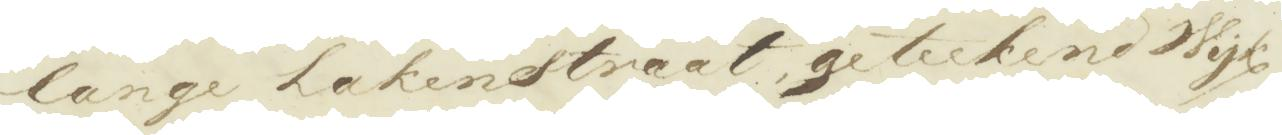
lange Lakenstraat, geteekend Wijk
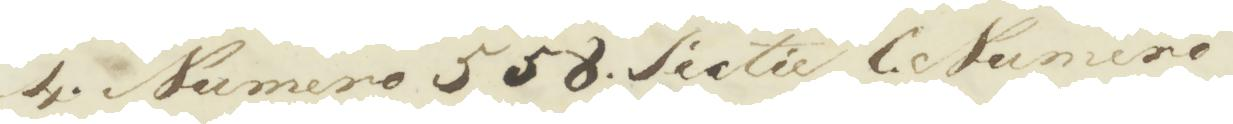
4. Numero 558. sectie C. Numero
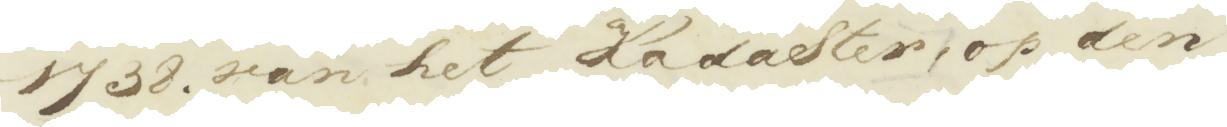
1738. van het Kadaster, op den
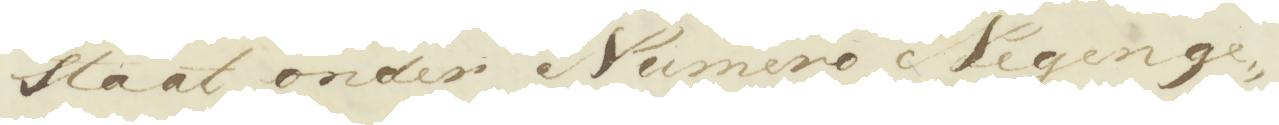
staat onder Numero Negenge„
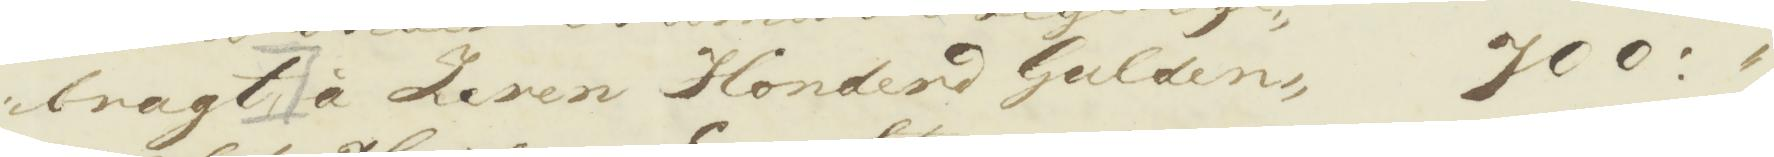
bragt] à Zeven Honderd Guldens„ 700: „
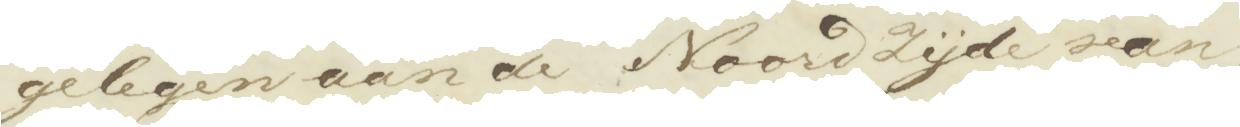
gelegen aan de Noord Zijde van
